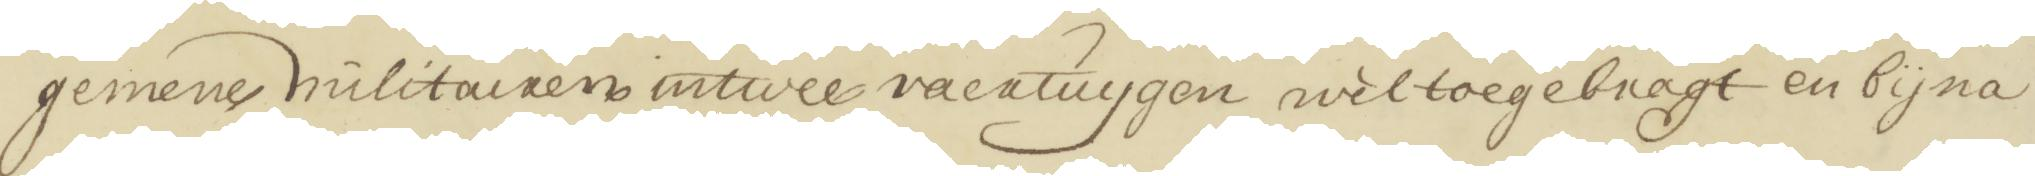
gemene militairen in twee vaertuijgen wel toegebragt en bij na
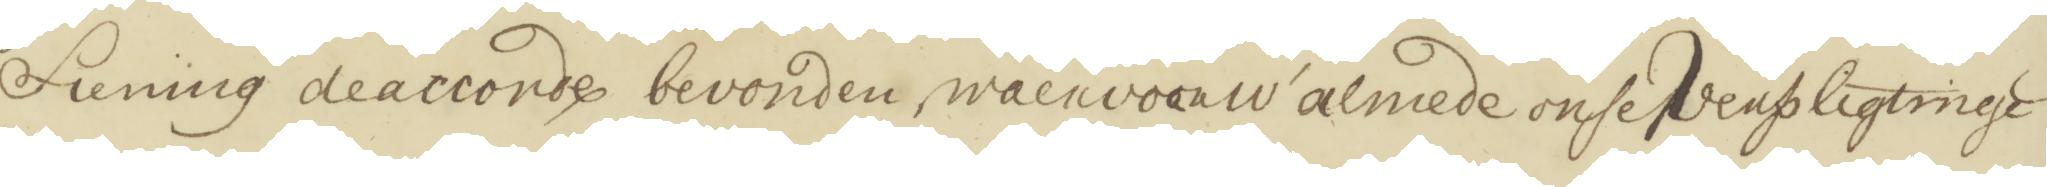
Siening deaccorde bevonden, waervoor w' almede onse verpligtinge
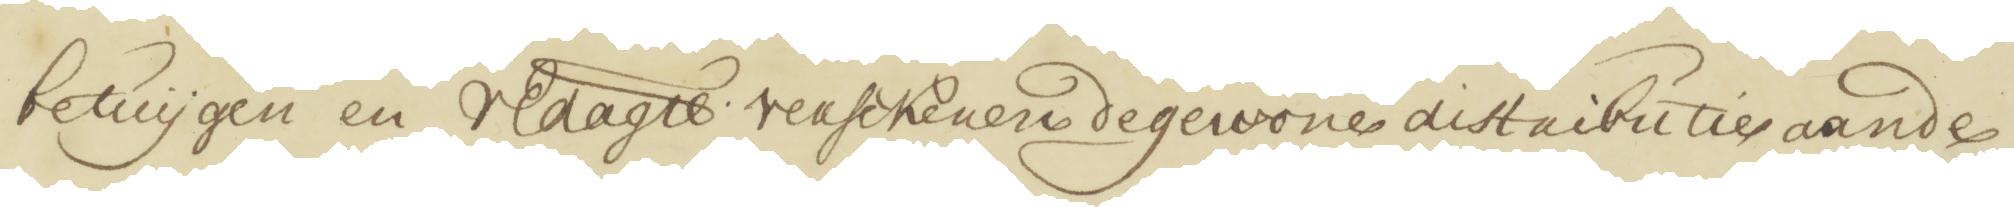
betuijgen en vEdagtb' versekeren de gewone distributie aan de
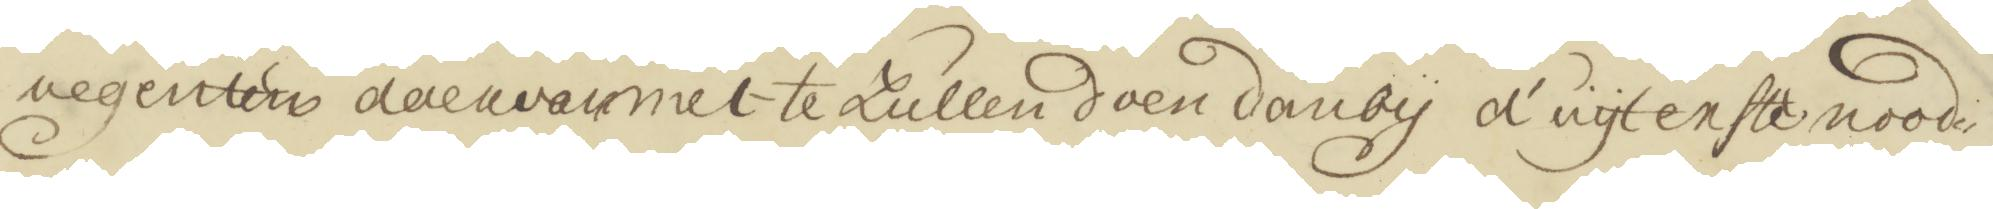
regenten daervan niet te zullen doen dan bij d'uijterste nood„
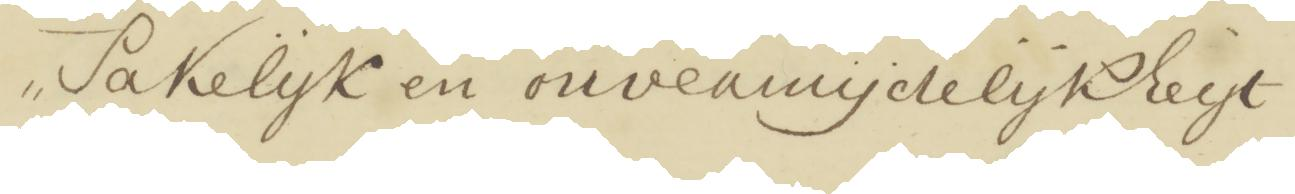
„sakelijk en onvermijdelijkheijt
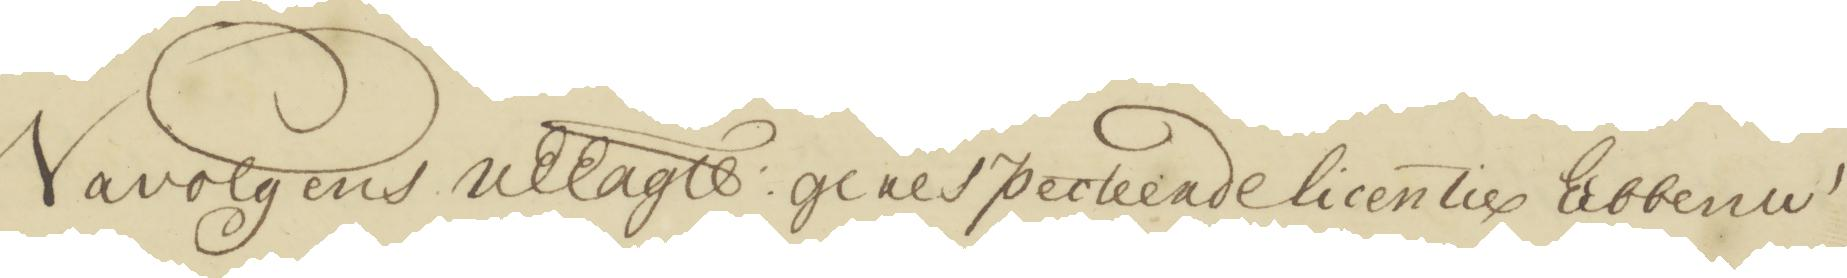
Navolgens uEEagtb: gerespecteerde licentie hebben w'
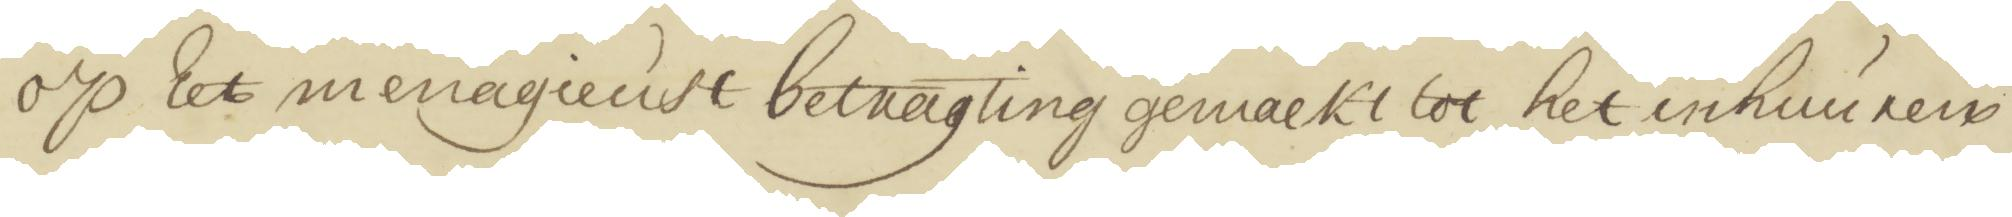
op het menagieust betragting gemaekt tot het inhuuren
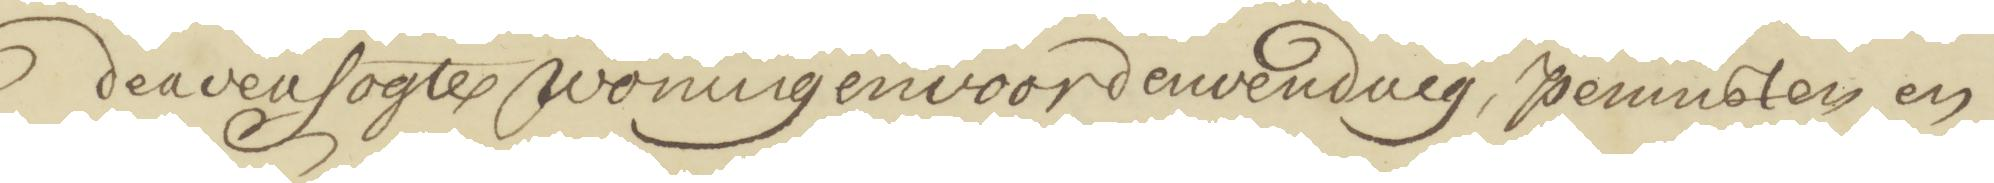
der versogte woning en voor den vendrig, pennisten en
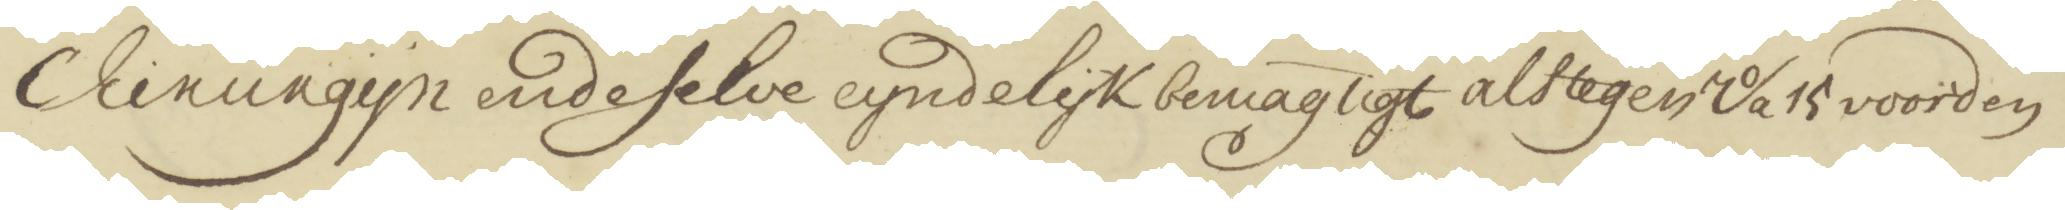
Chirurgijn en deselve eyndelijk bemagtigt als tegen r o/a 15 voor den
